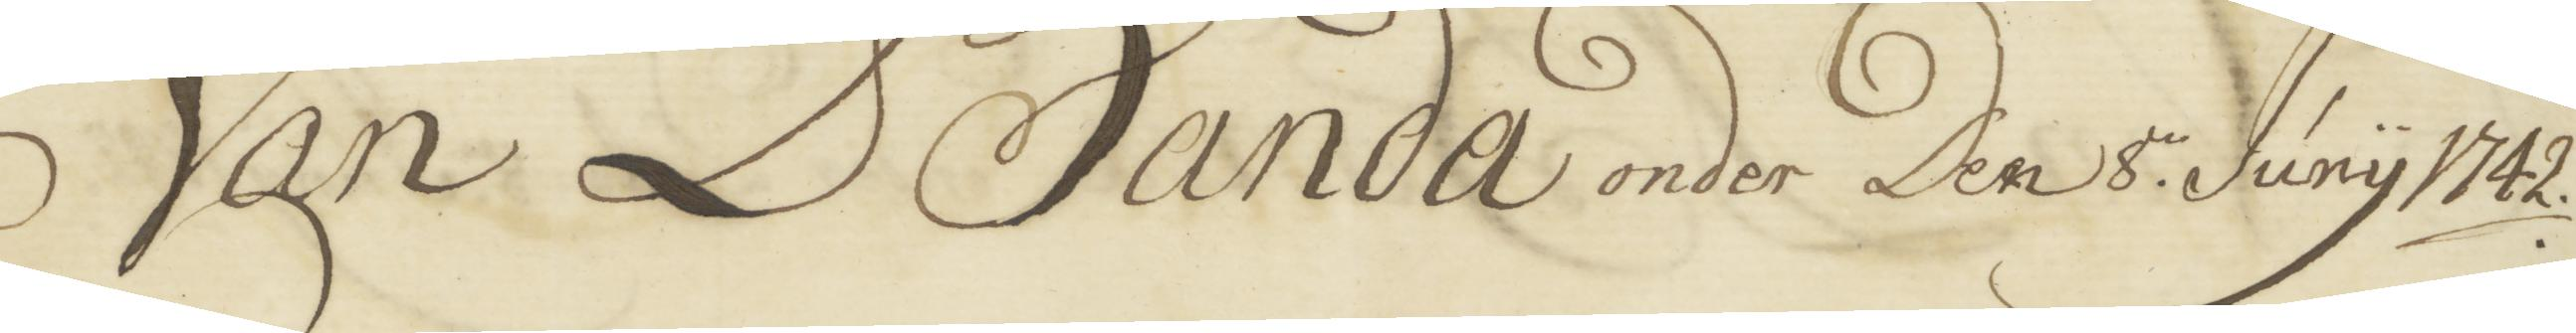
Van Banda onder Den 8.n Junij 1742.
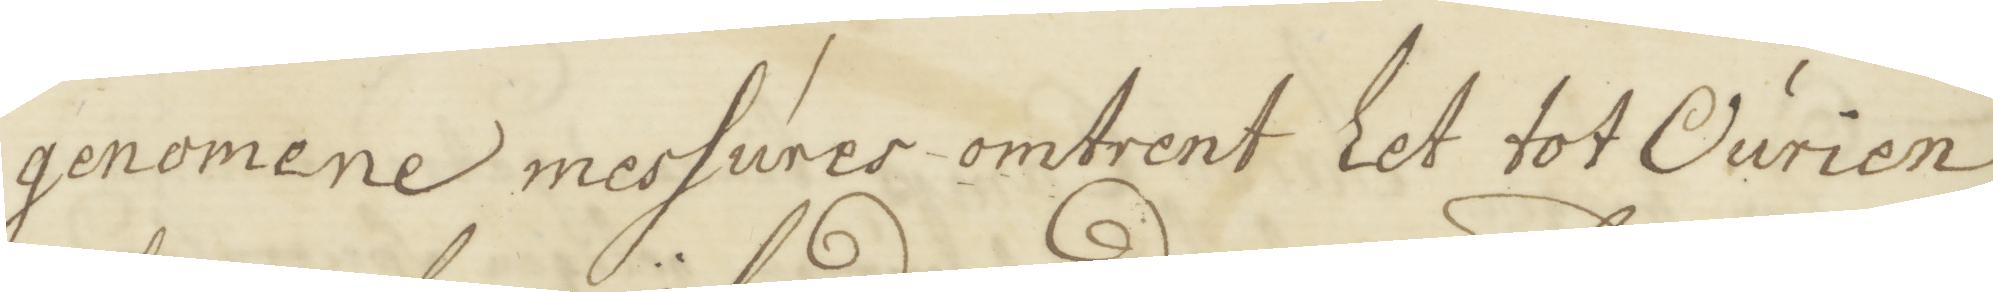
genomene messures omtrent het tot Ourien
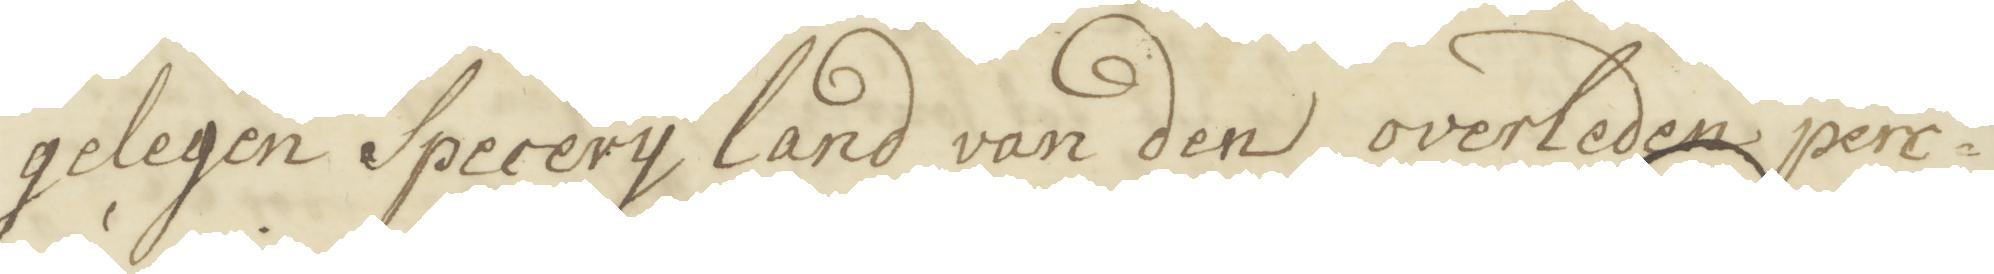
gelegen specerij land van den overleden perc=
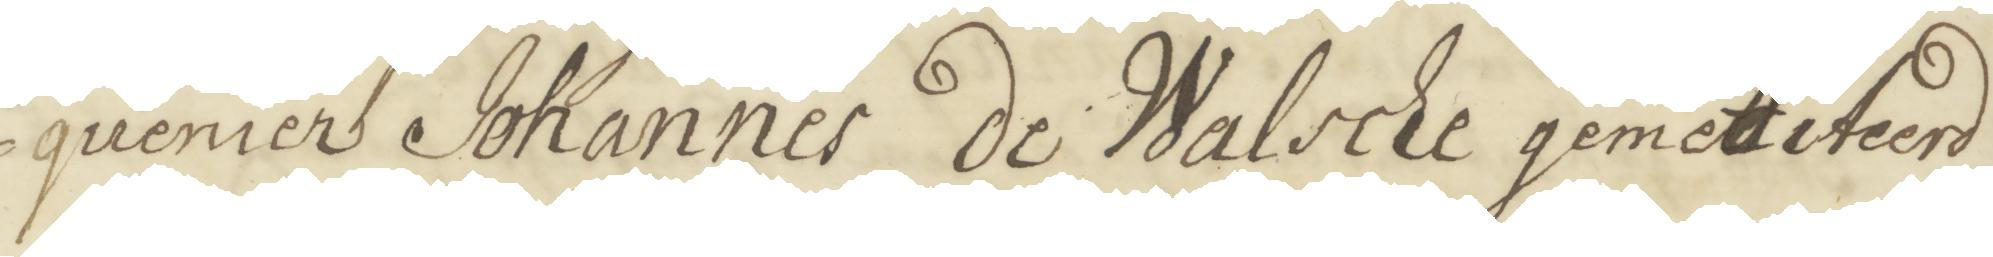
=quenier Iohannes de Walsche gemettiteerd
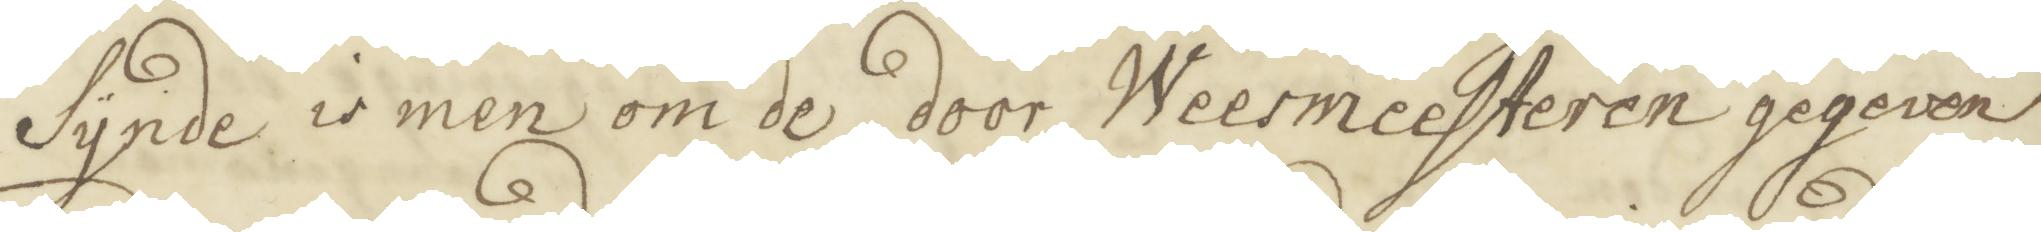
sijnde is men om de door Weesmeesteren gegeven
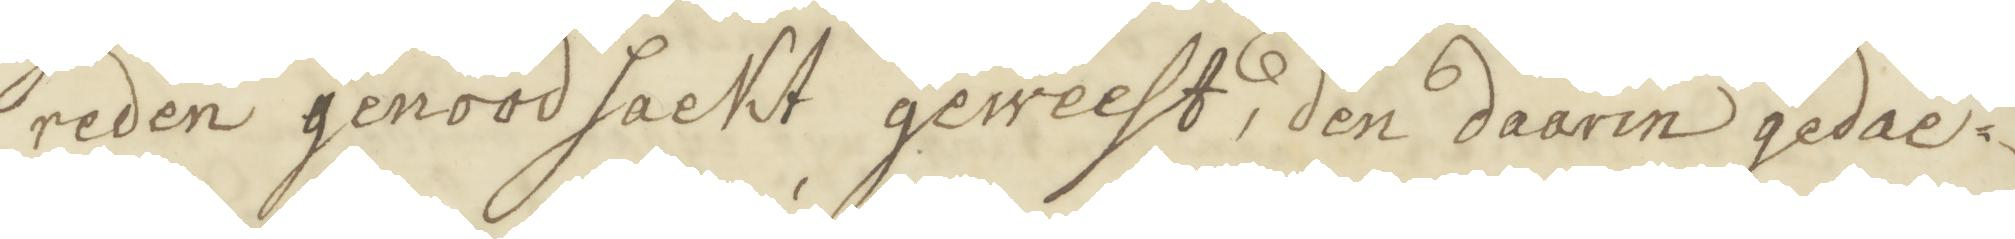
reden genood saekt geweest, den daarin gedae„
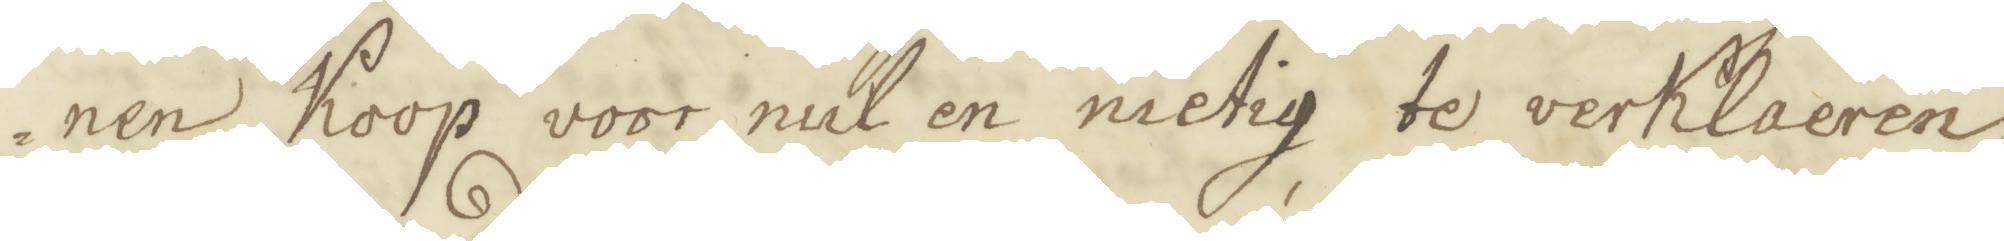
„nen koop voor nul en nietig te verklaeren
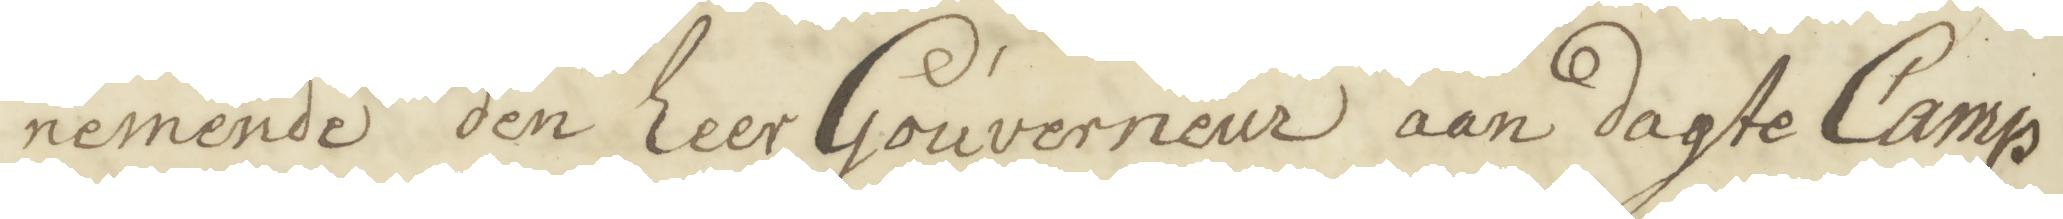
nemende den heer Gouverneur aan dagte Camp
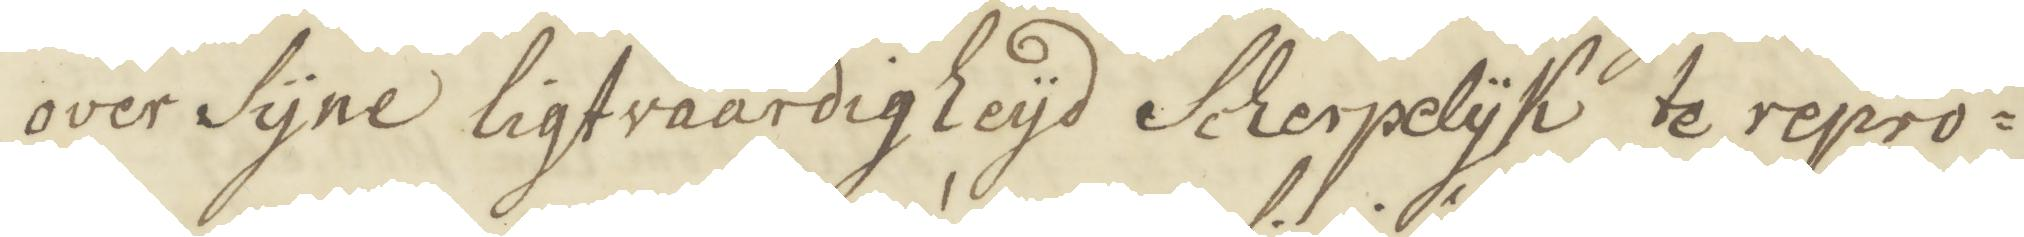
over sijne ligtvaardigheijd scherpelijk te repro=
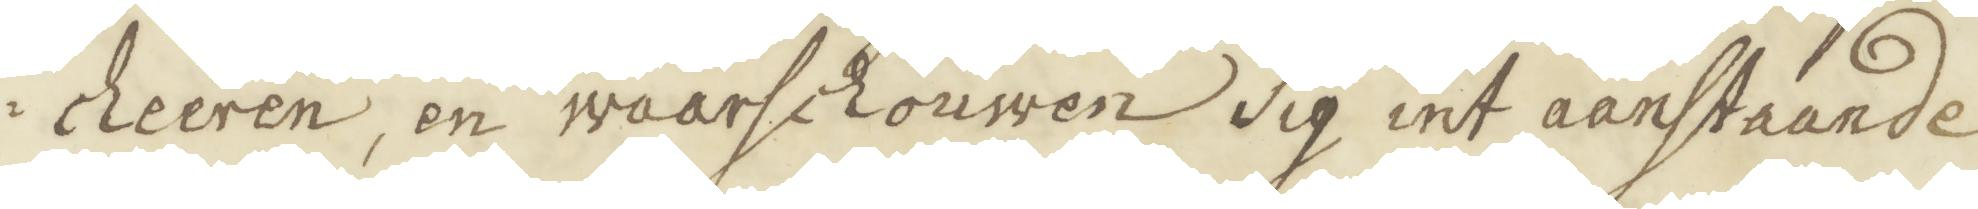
=cheeren, en waarschouwen sig in't aanstaande
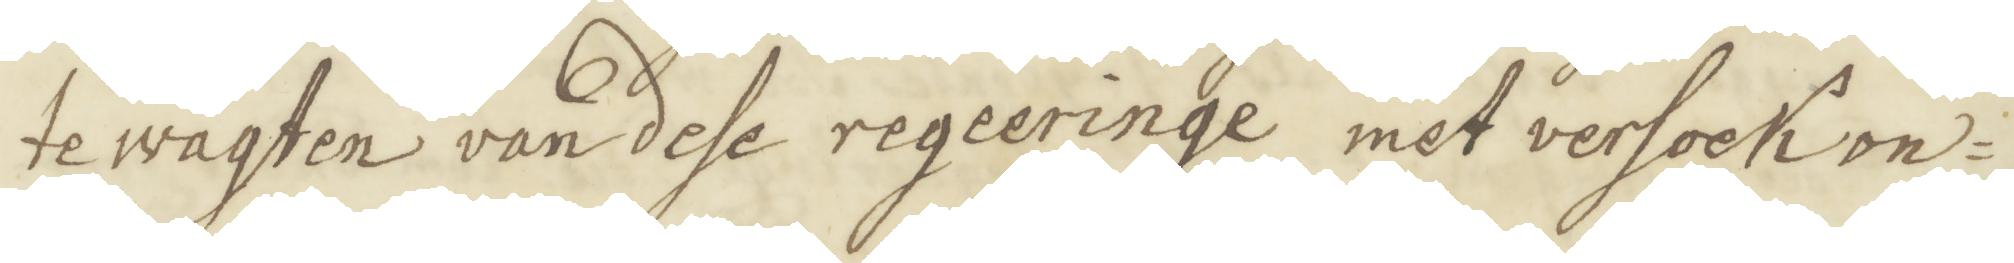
te wagten van dese regeeringe met versoek on=
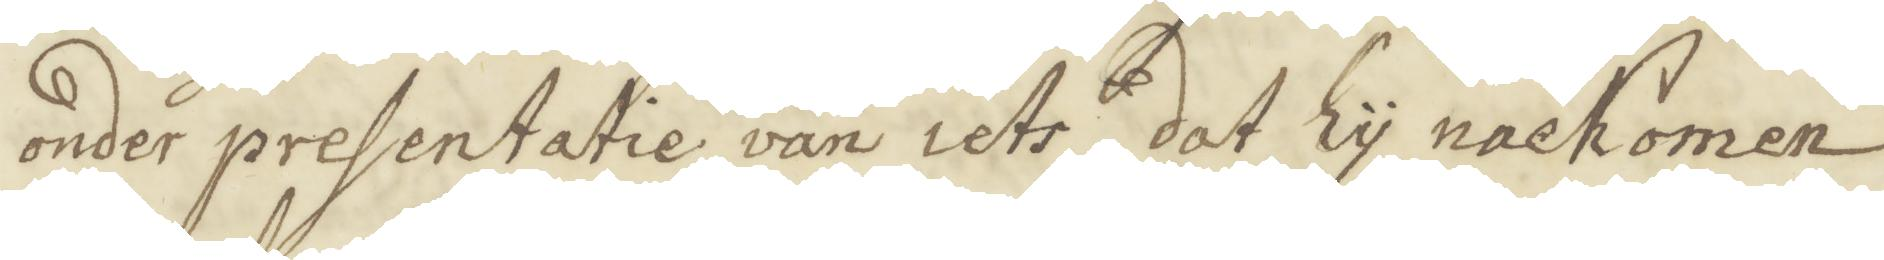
onder presentatie van iets dat hij naekomen
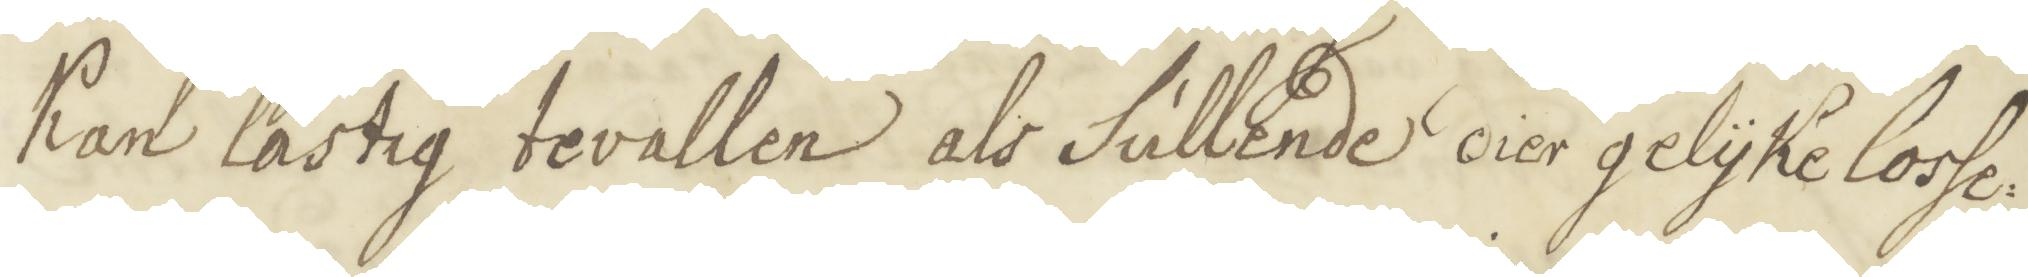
kan lastig te vallen als sullende dier gelijke losse:
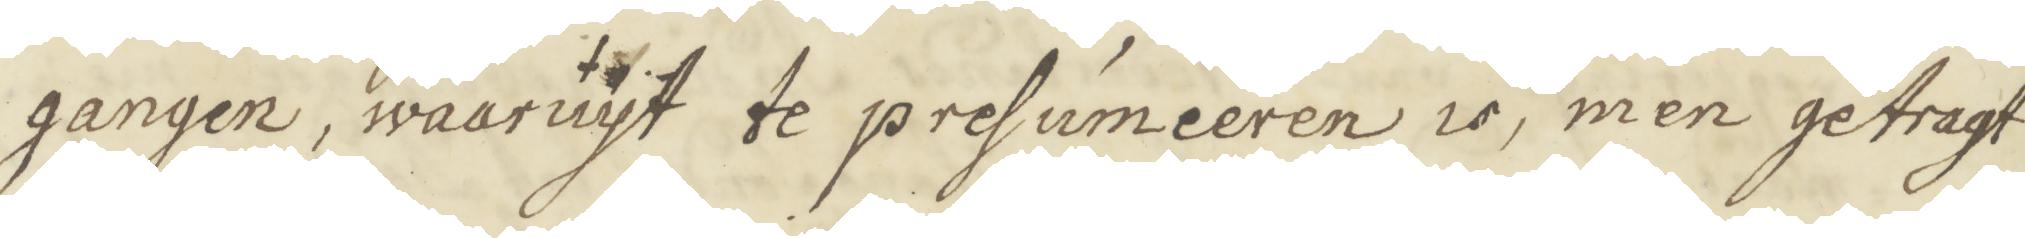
gangen, waar uijt te presumeeren is, men getragt
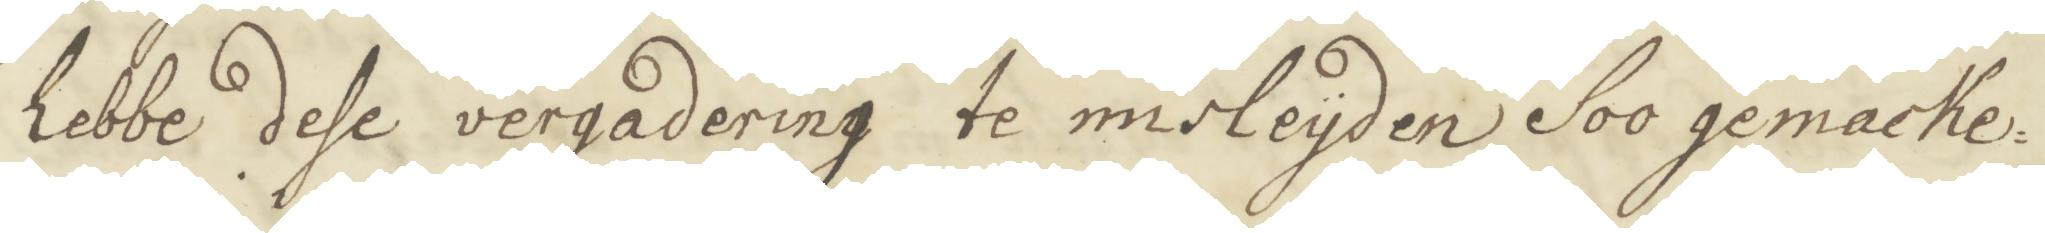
hebbe dese vergadering te misleijden soo gemacke=
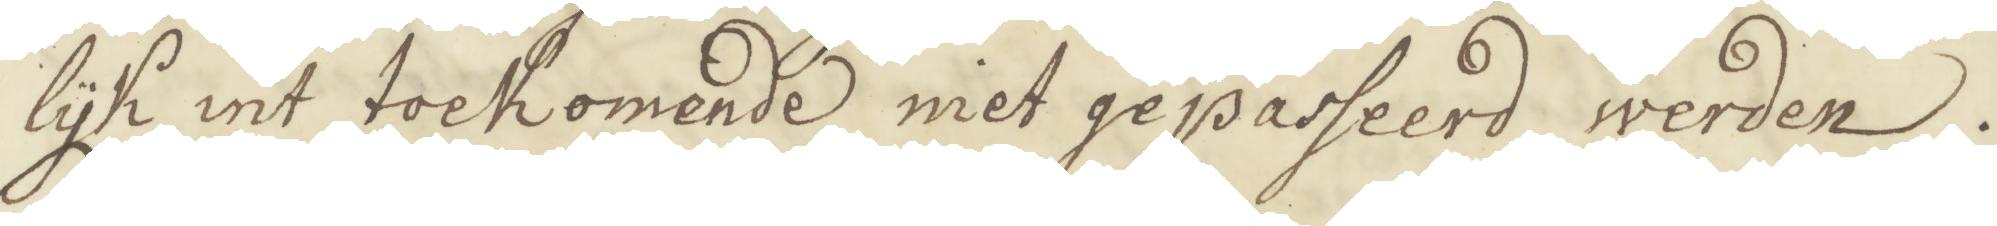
lijk in't toekomende niet gepasseerd werden.
